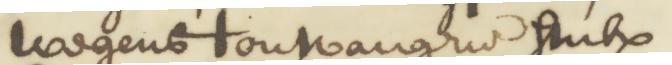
Wegens 't ontvangene stukx
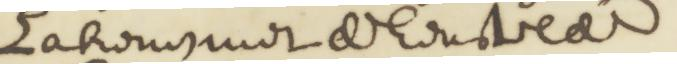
Lakenen met deherstelde
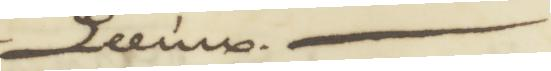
Leeuw. —
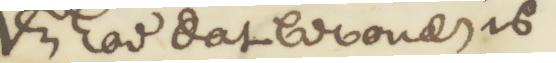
En hoe dat bevonden is
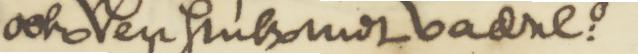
ook Een stukx met Vaderl:d
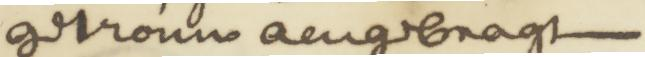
getrouw aengebragt
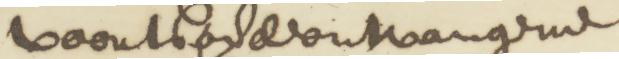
voorts over de ontvangene
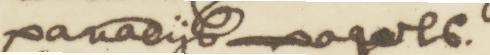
paradijs vogels.
